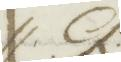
„ 9
